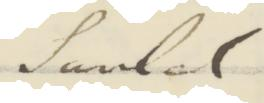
sarlet
